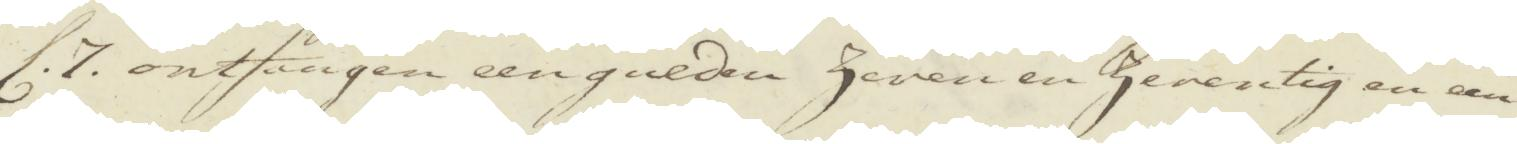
C.7. ontfangen een gulden zeven en zeventig en een
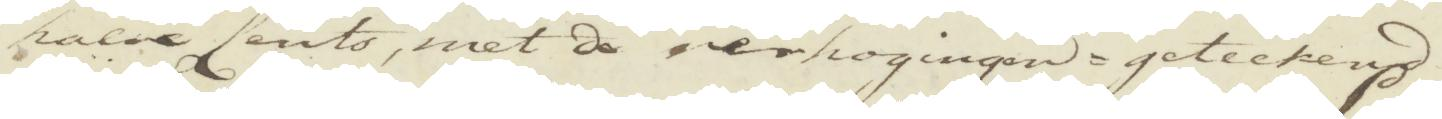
halve Cents, met de verhogingen = geteekend =
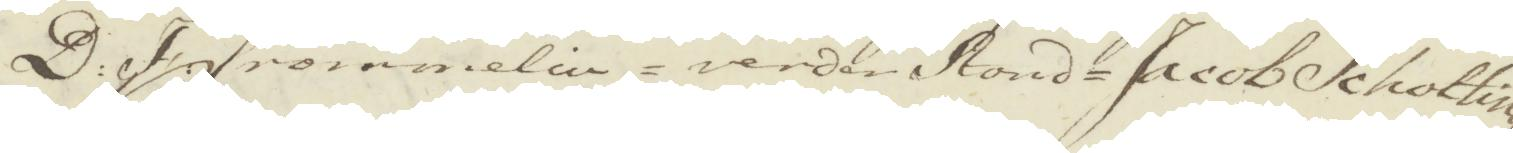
D: T: Crommelin = verder stond = Jacob Scholting
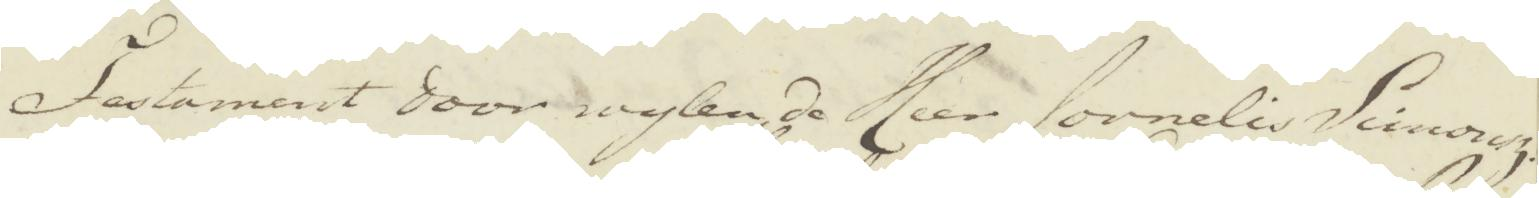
Testament door wylen de Heer Cornelis Simonsz
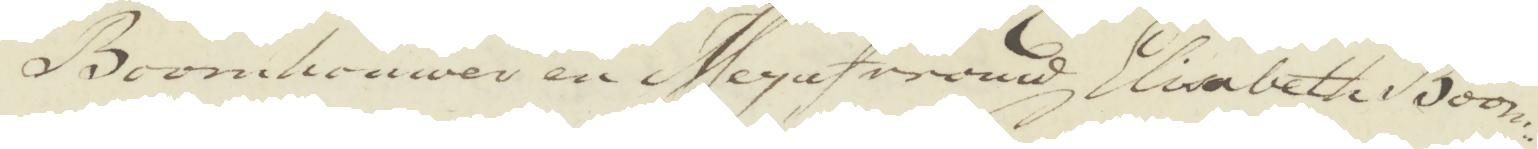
Boomhouwer en Mejufvrouwe Elisabette Boom„
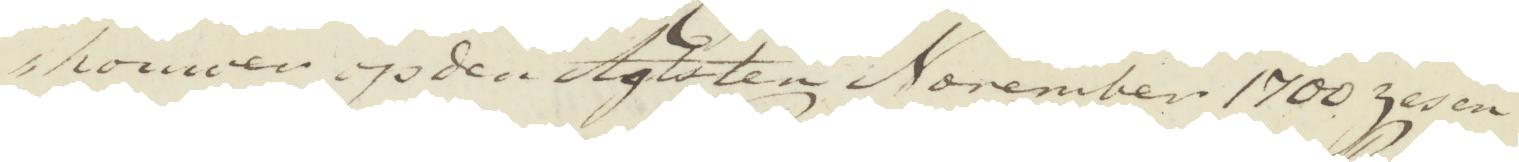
„houwer op den Agtsten November 1700 zes en
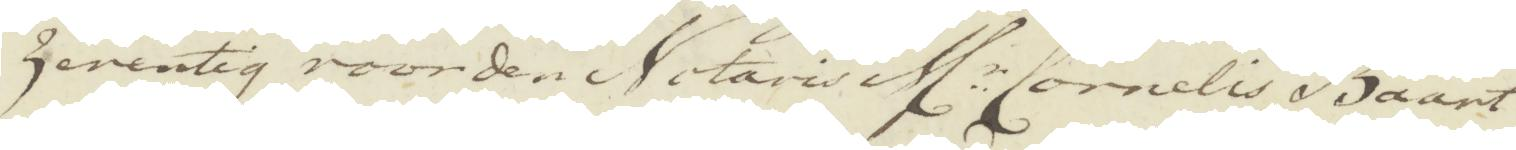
zeventig voor den Notaris M:r Cornelis Baart
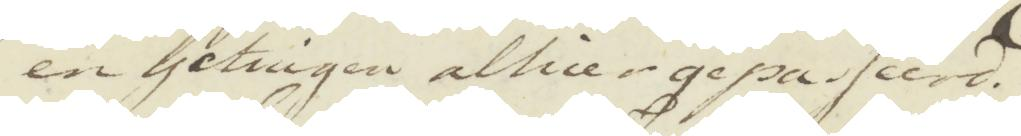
en Getuigen alhier gepasseerd.
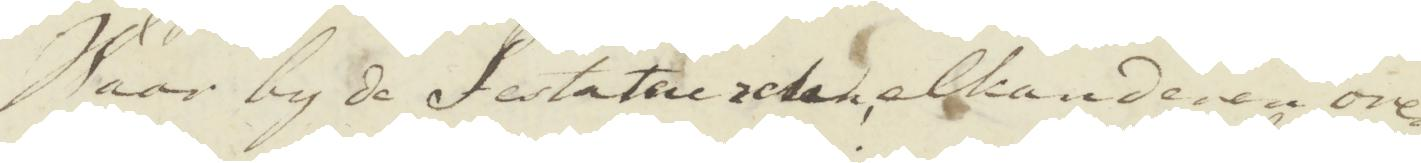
Waar by de Testateurden elkanderen over
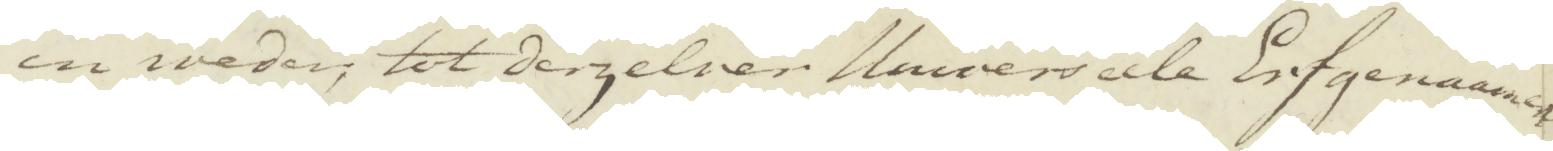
en weder; tot derzelver Universeele Erfgenaamen
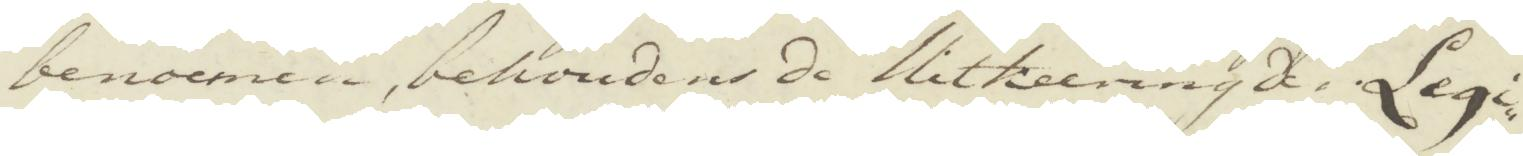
benoemen, behoudens de Uitkeering de Legi
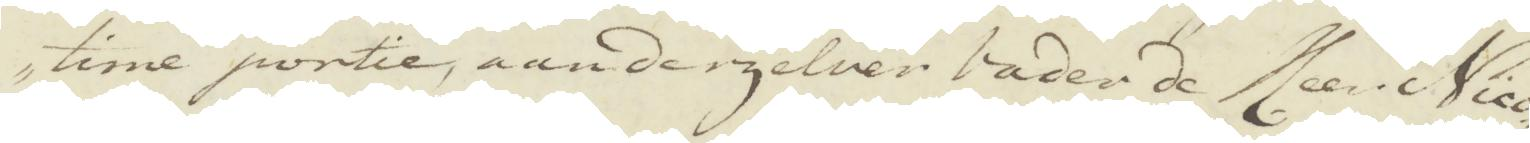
„time portie, aan derzelver vader de Heer Nico
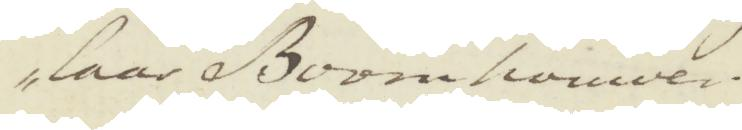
„laas Boomhouwer
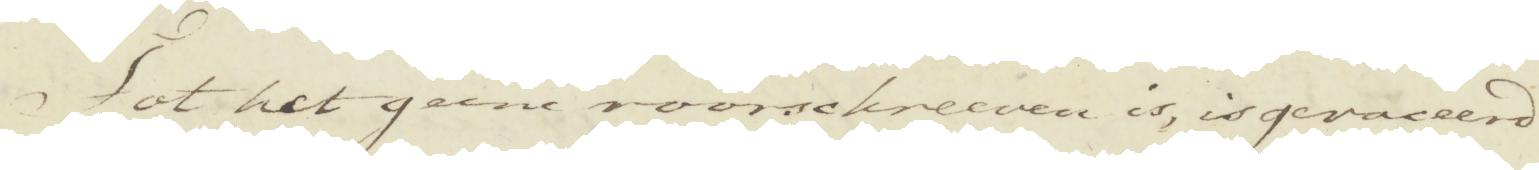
Tot het geene voorschreeven is, is gevaceerd
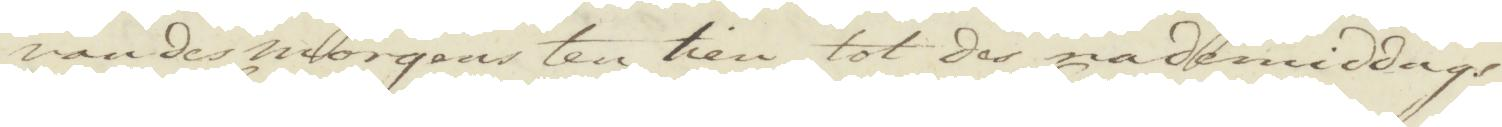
van des morgens ten tien, tot des na de middags
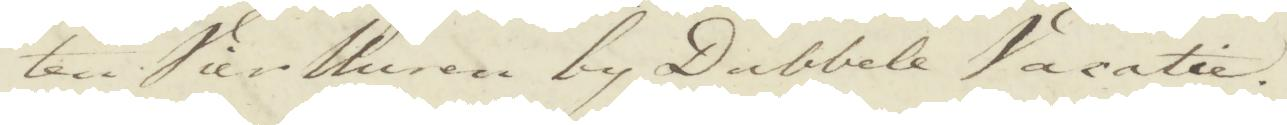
ten Vier Uuren by Dubbele Vacatie.
